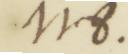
118.
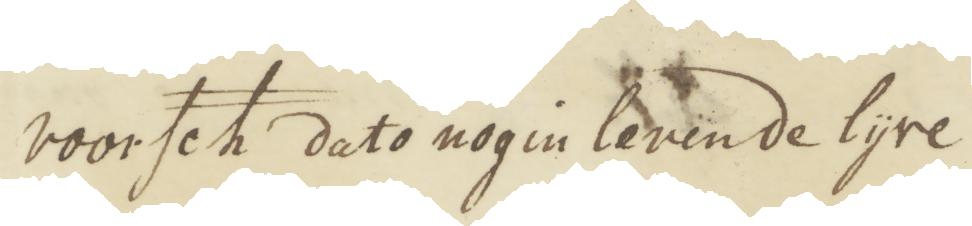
voorsch dato nog in levende lijve
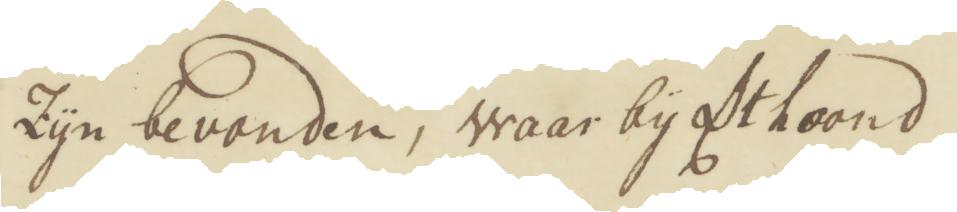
zijn bevonden, waar bij verthoond
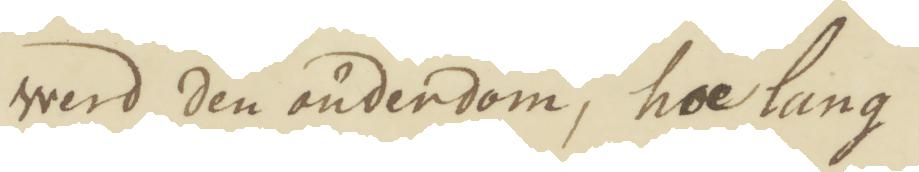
werd den ouderdom, hoe lang
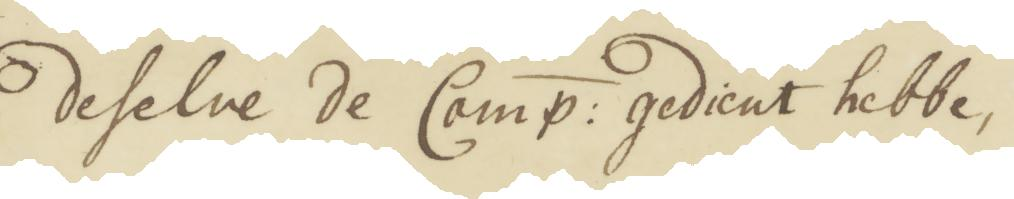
deselve de Comp: gedient hebbe,
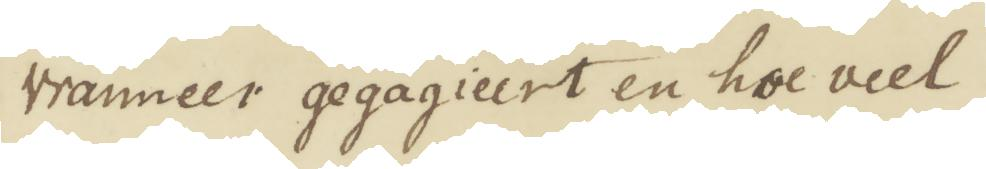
wanneer gegagieert en hoe veel
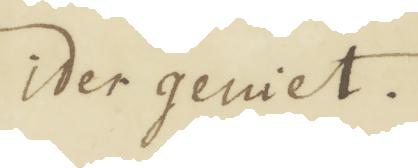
ider geniet.
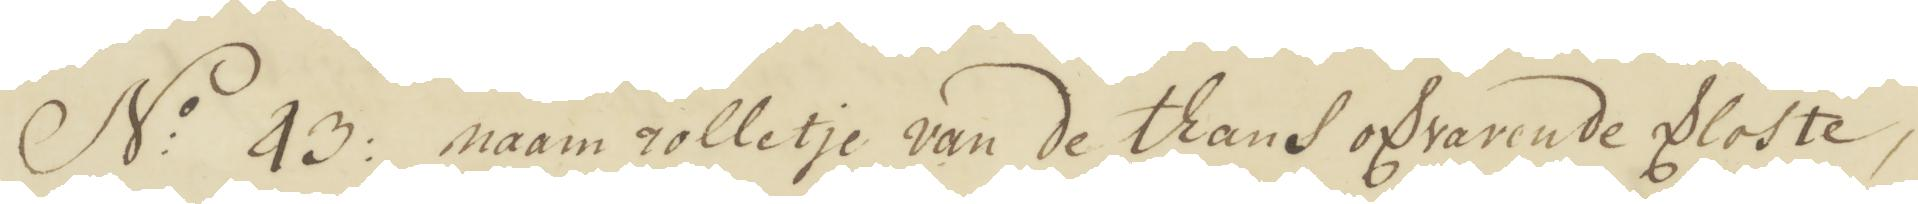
N:o 43: naam rolletje van de thans overvarende verloste,
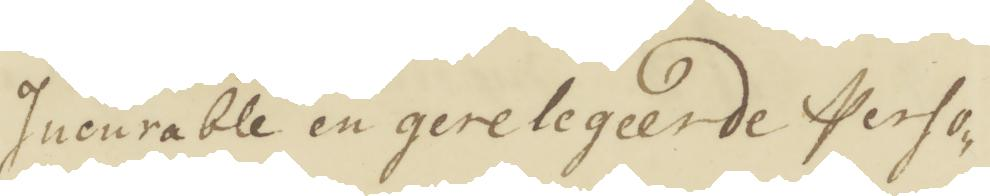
Jncurable en gerelegeerde perso„
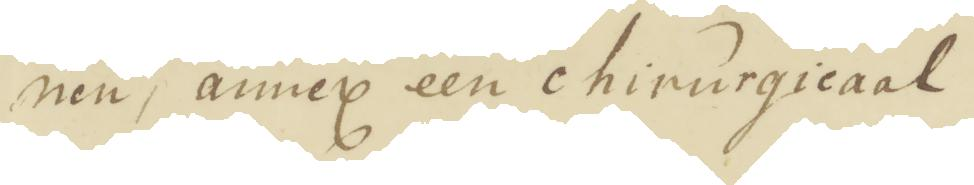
nen, annex een chirurgicaal
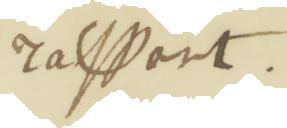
rapport.
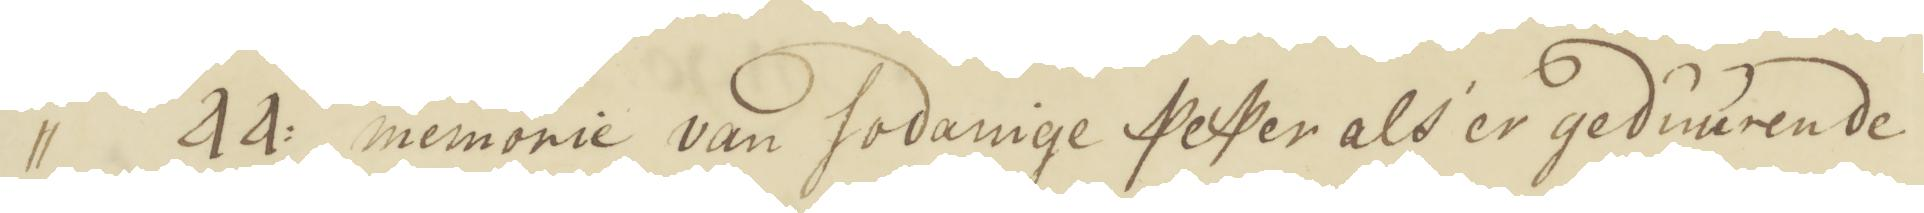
„ 44: memorie van sodanige peper als 'er geduurende
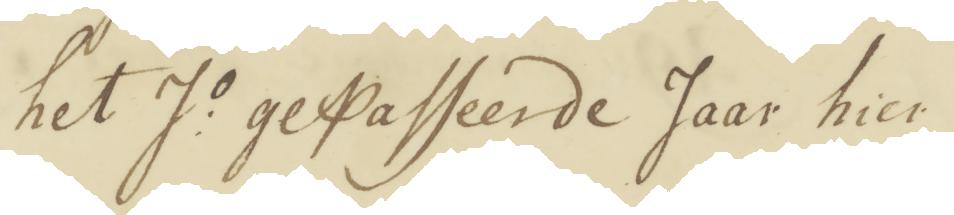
het J:o gepasseerde Jaar hier
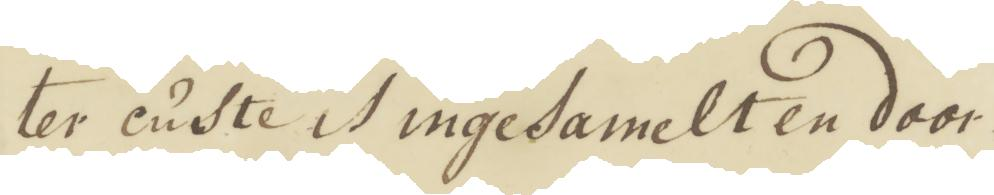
ter custe is ingesamelt en door
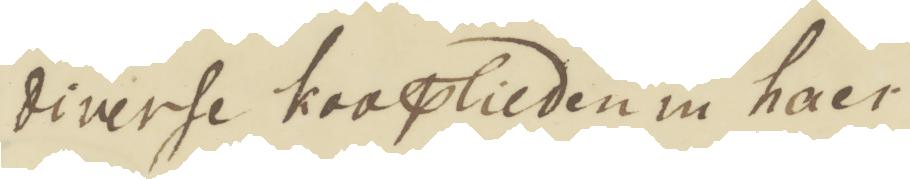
diverse kooplieden in haer
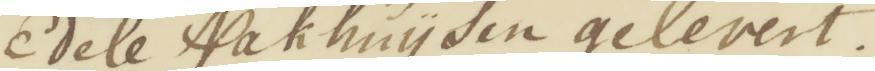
Edele pakhuijsen gelevert.
